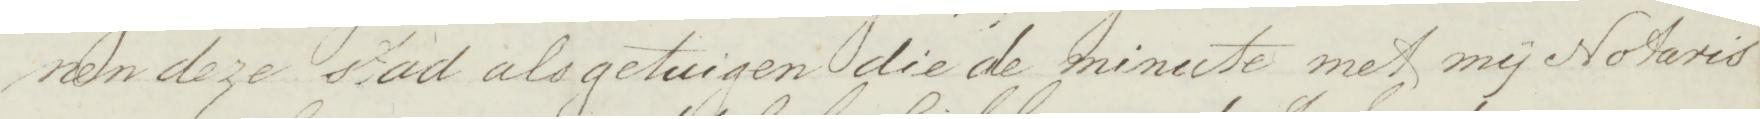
nen deze stad als getuigen die de minute met mij Notaris
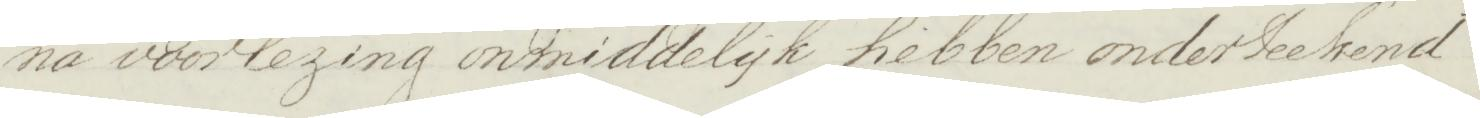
na voorlezing onmiddelijk hebben onderteekend.
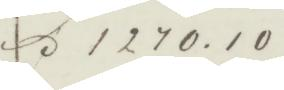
ƒ1270.10
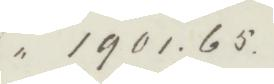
„ 1901.65.
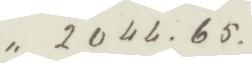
„ 2044. 65.
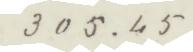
305. 45
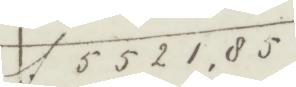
ƒ 5521,85
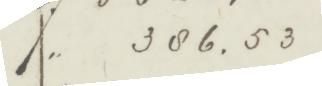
. 386.53
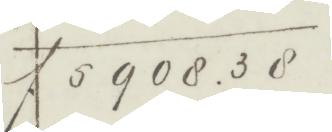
ƒ 5908.38
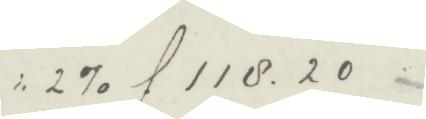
„ 2% ƒ 118. 20 „
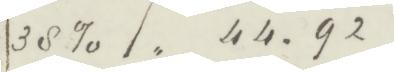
38% „ 44. 92
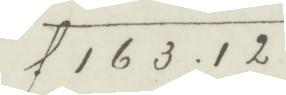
ƒ163.12
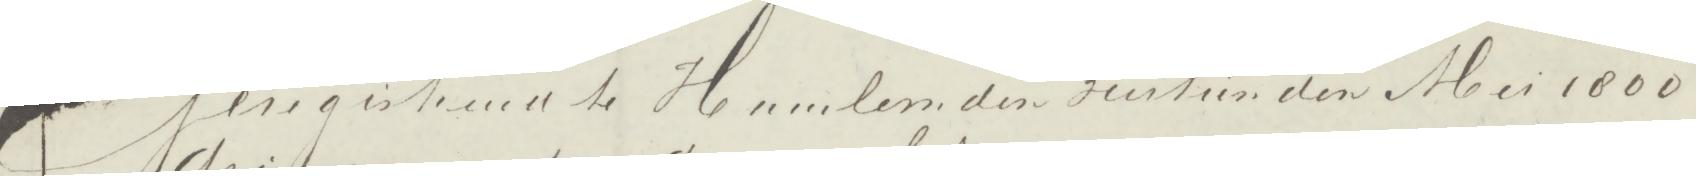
Geregistreerd te Haarlem den veertien den Mei 1800
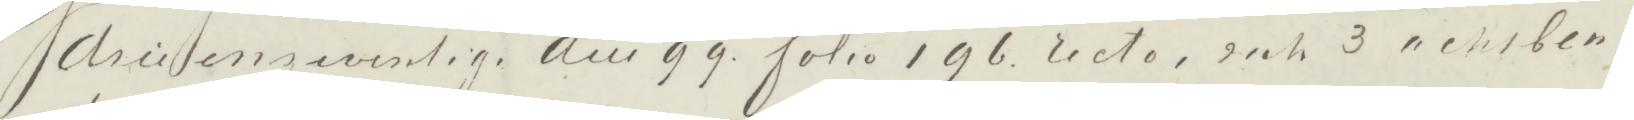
drie en zeventig, deel 99. folio 196. recto, vak 3 acht bla
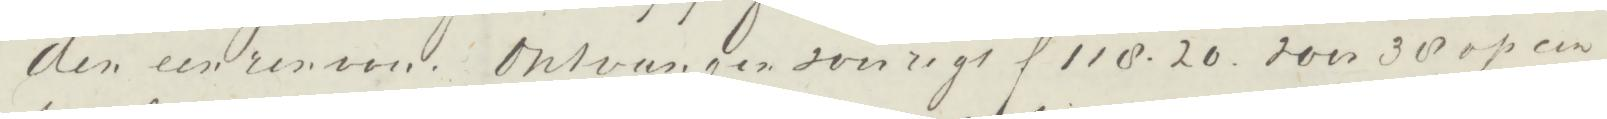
den een renvooi. Ontvangen voor regt ƒ 118. 20. voor 38 opcen
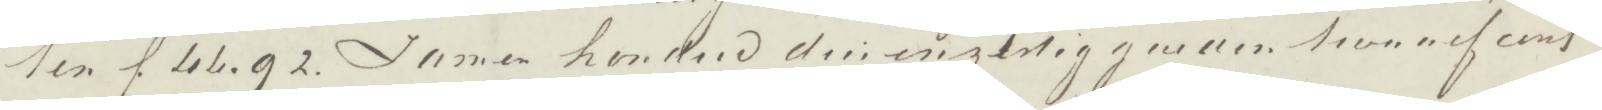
ten ƒ 44.92. Zamen honderd drie en zestig gulden twaalf Cents
